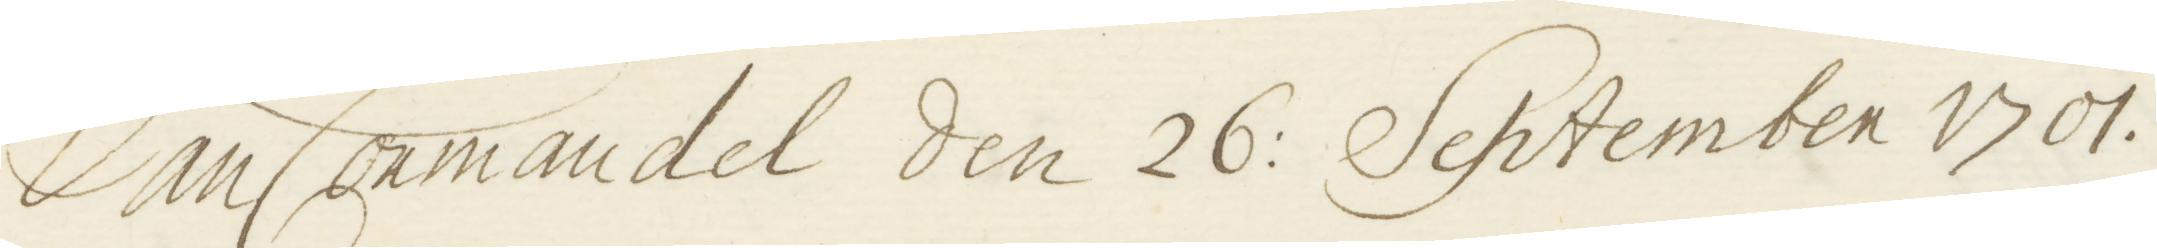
Van Cormandel den 26: September 1701.
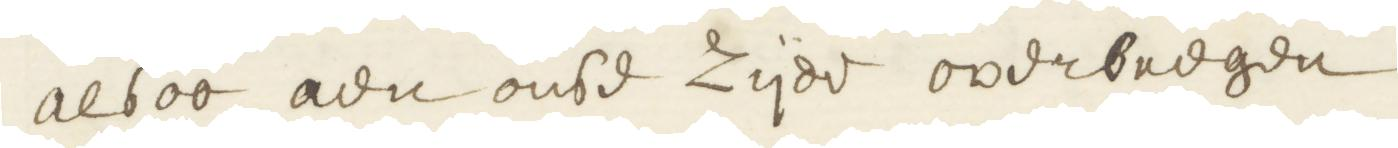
alsoo aen onse zijde overbregen
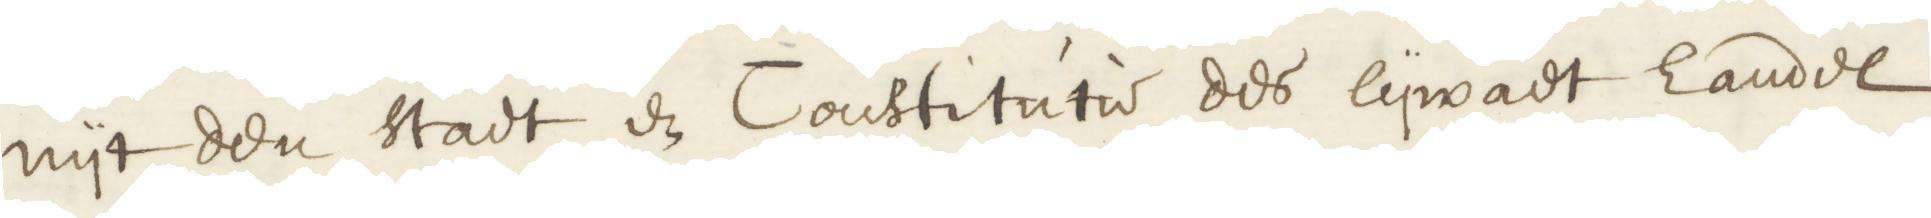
uijt den staet en Constitutie des lijwaet handel
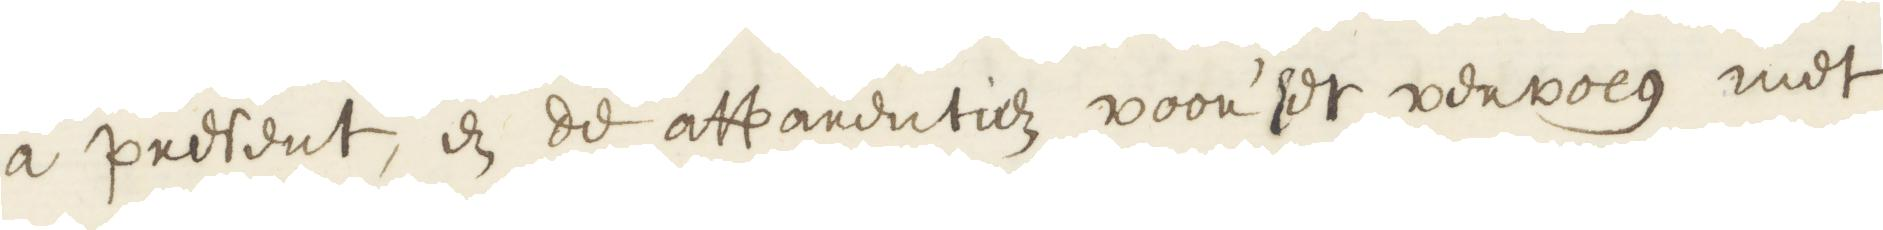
â present, en de apparentien voor' het vervolg met
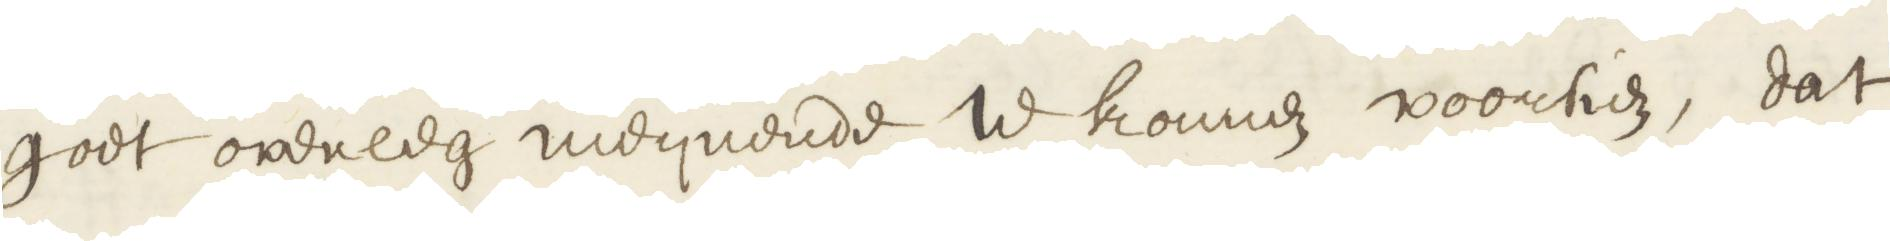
goet overleg meijnende te konnen voorsien, dat
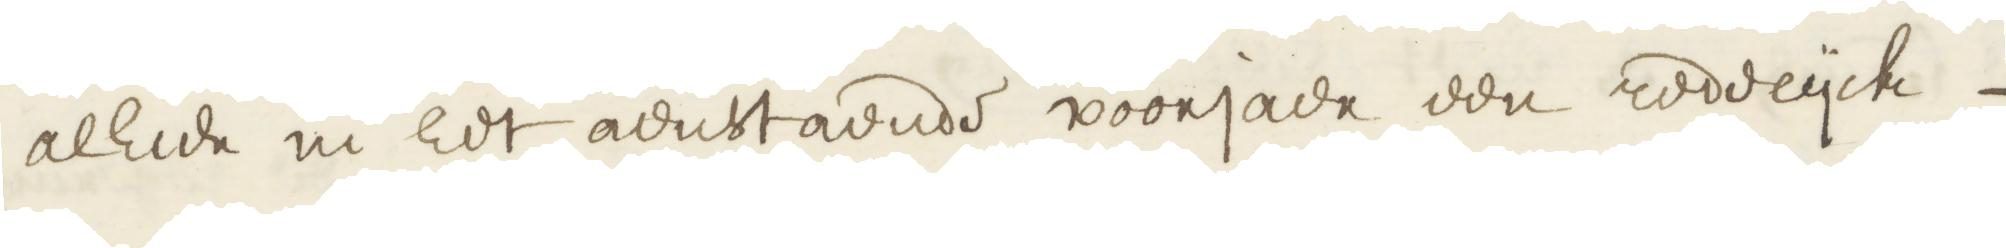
alhier in het aenstaende voorjaer een redelijck
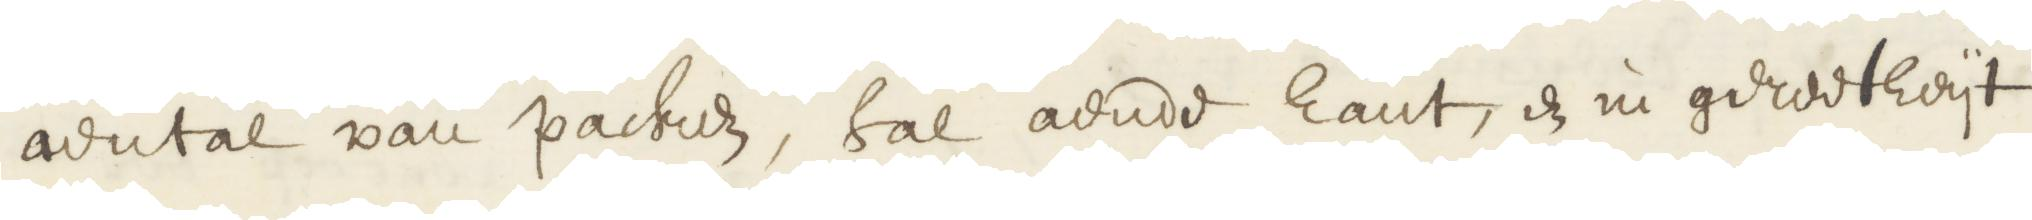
aental van packen, sal aende hant, en in gereetheijt
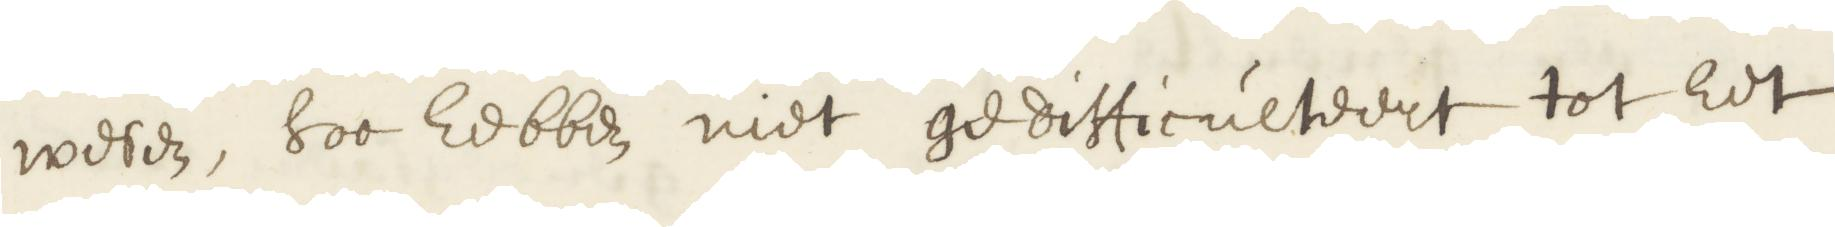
wesen, soo hebben niet gedifficulteert tot het
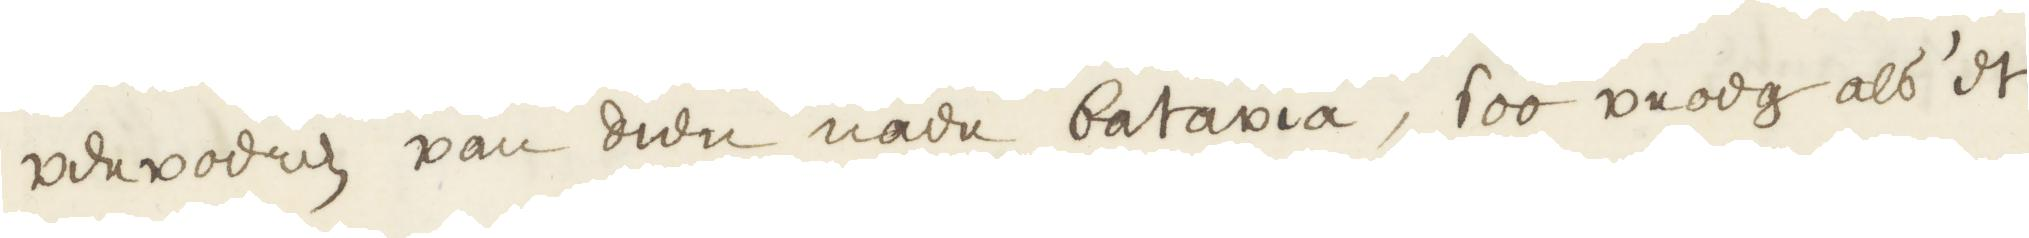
vervoeren van dien naer batavia, soo vroeg als 'et
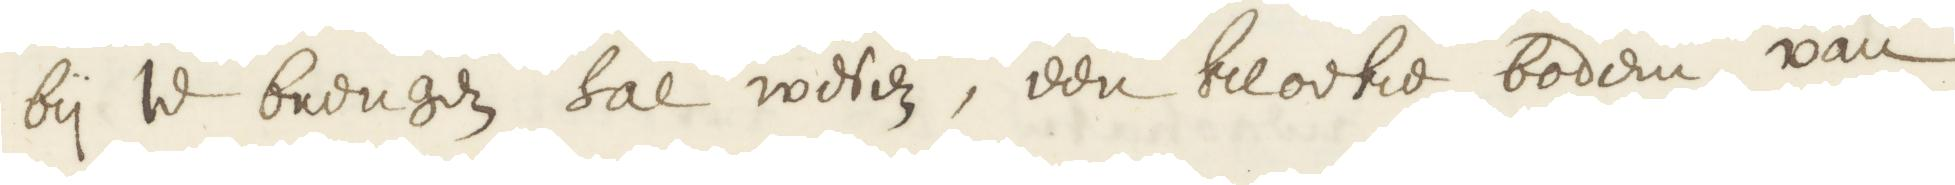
bij te brengen sal wesen, een kloeke bodem van
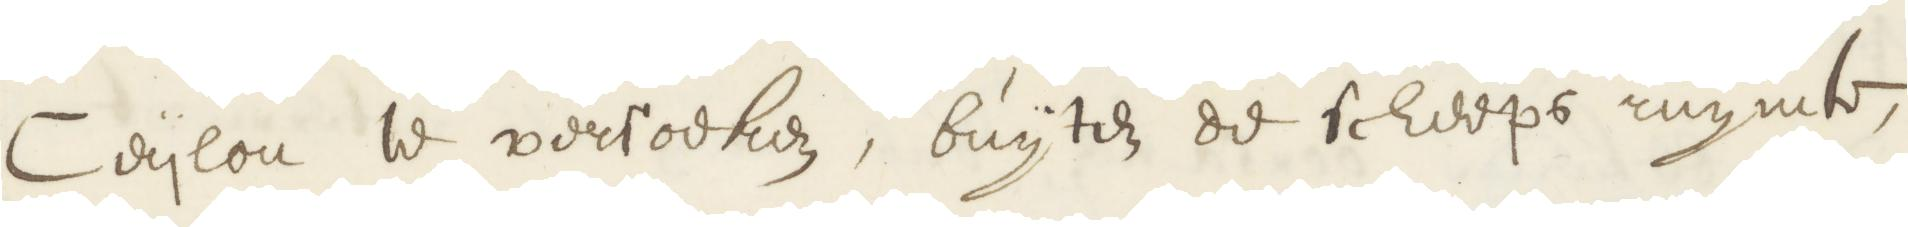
Ceijlon te versoeken, buijten de scheeps ruijmte,
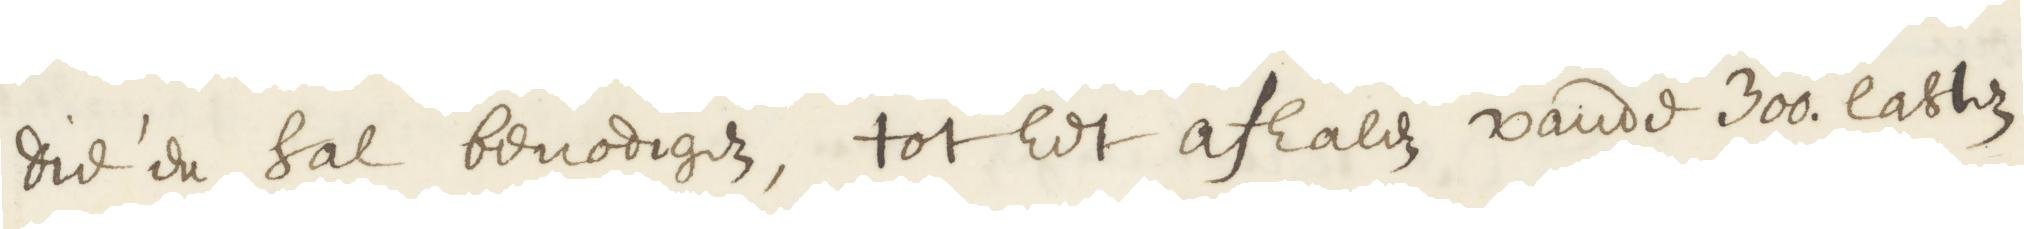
die 'er sal benodigen, tot het afhalen vande 300. lasten
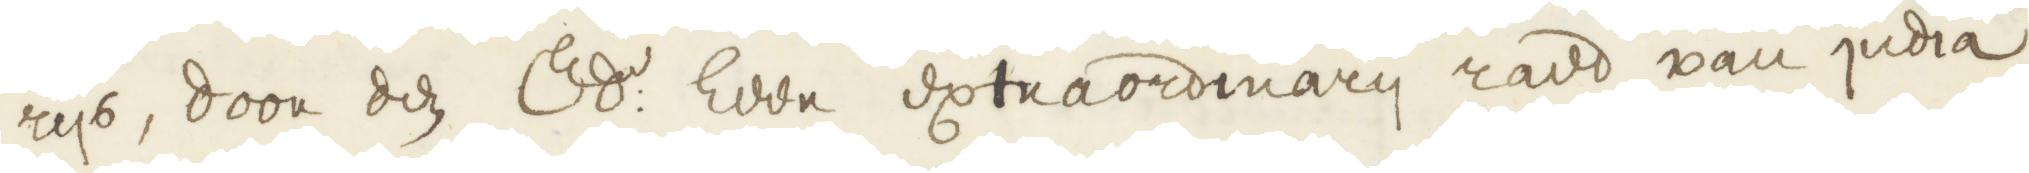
rijs, door den Ed: heer extraordinarij raed van jndia
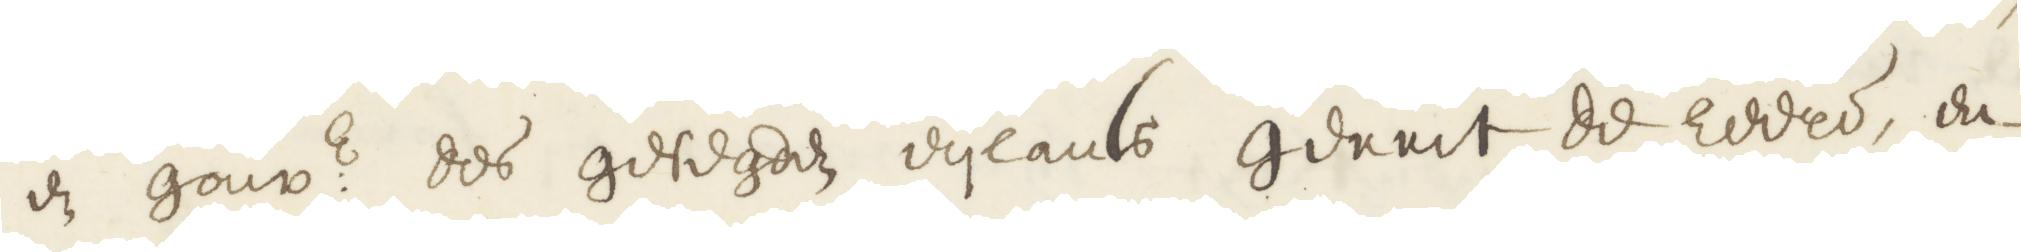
en gouv:r des gesegden eijlants gerrit de heere, en
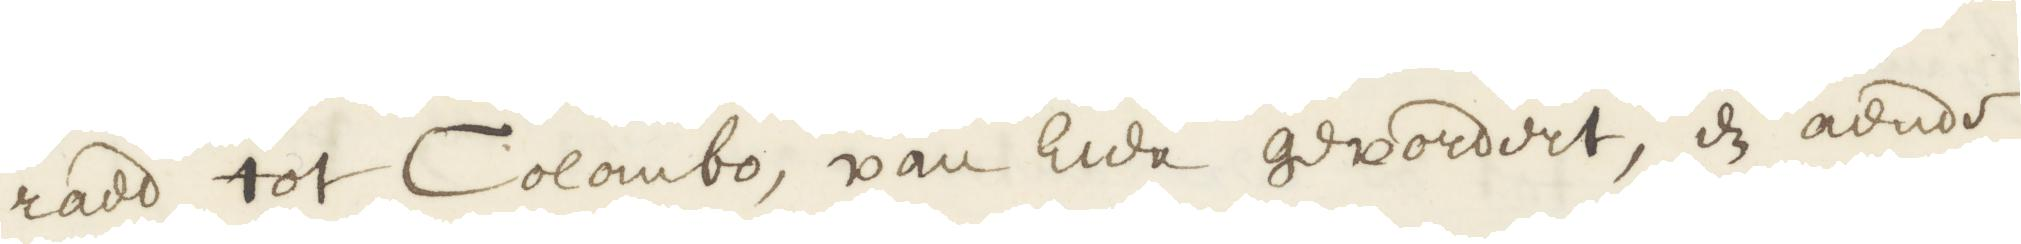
raed tot Colombo, van hier gevordert, en aende
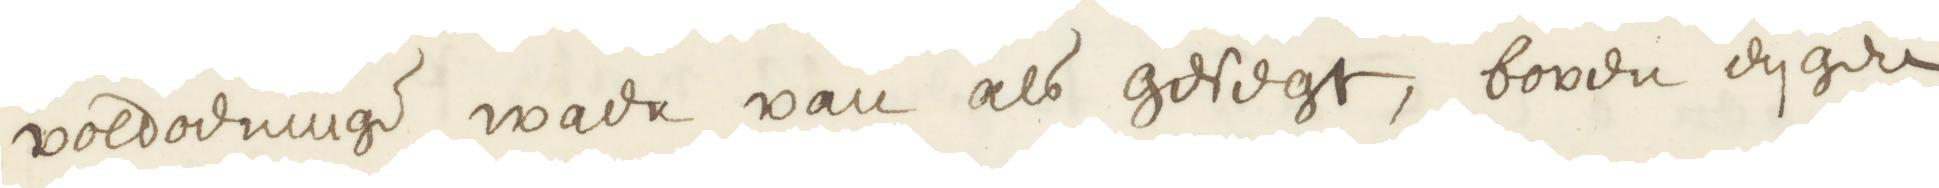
voldoeninge waer van als gesegt, boven eijgen
